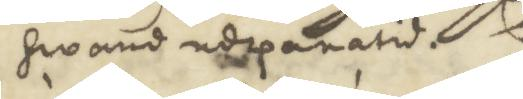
sware reparatie.
